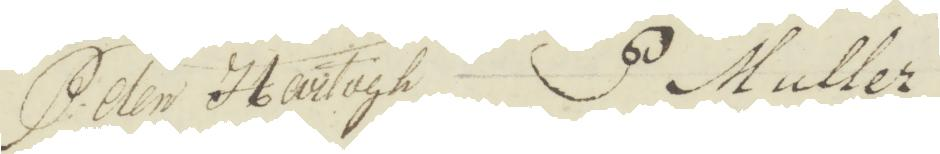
P: den Hartogh P Muller
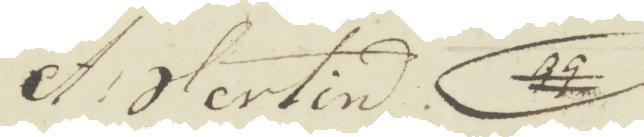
A: Hertin gg
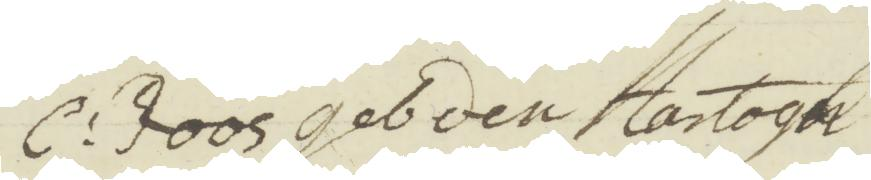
C. Roos geb den Hartogh
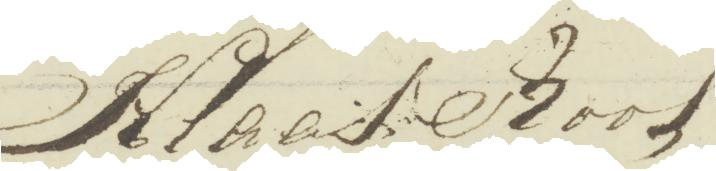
Klaas Roos
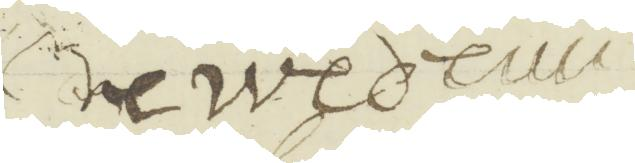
de weduw
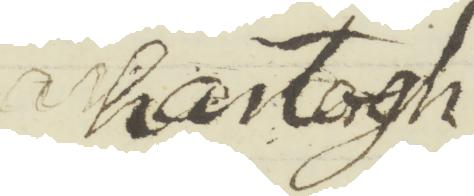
har hartogh
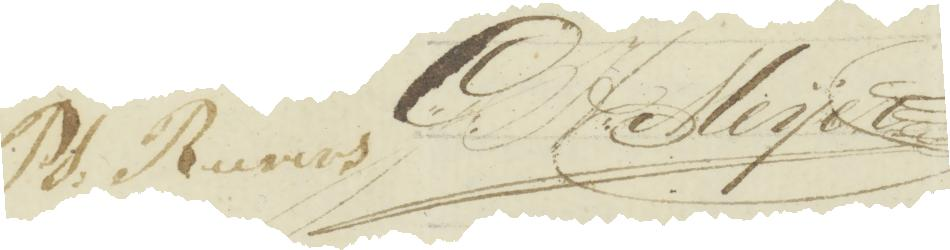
Ps: Reevers G: H: Meijer
